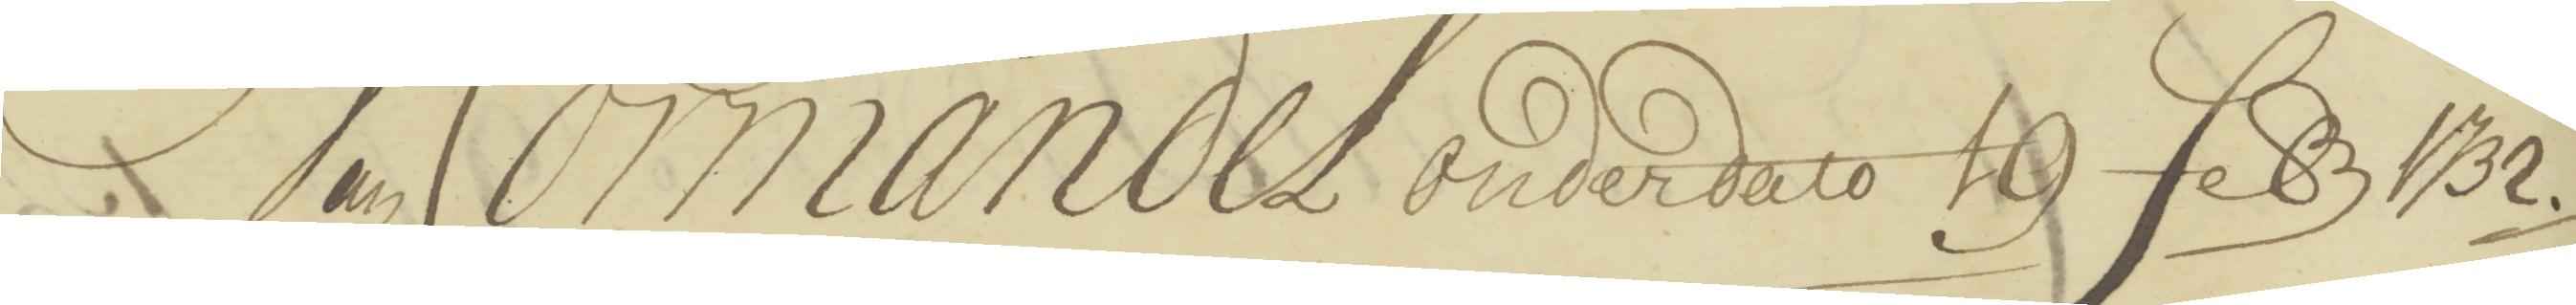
Van Cormandel onder dato 19 feb 1732.
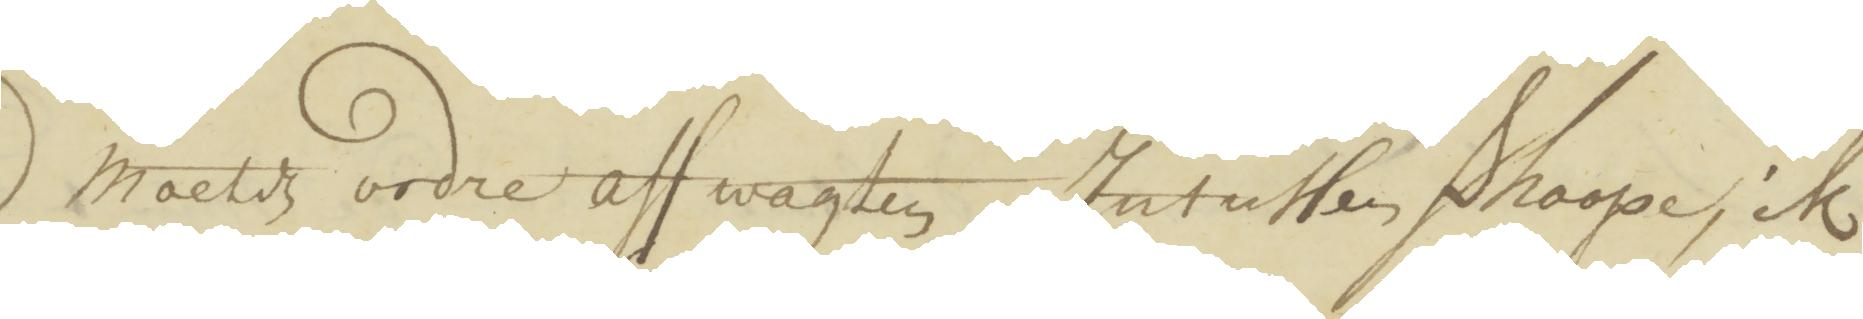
moeten ordre affwagten, Jntussen verhoope, ik
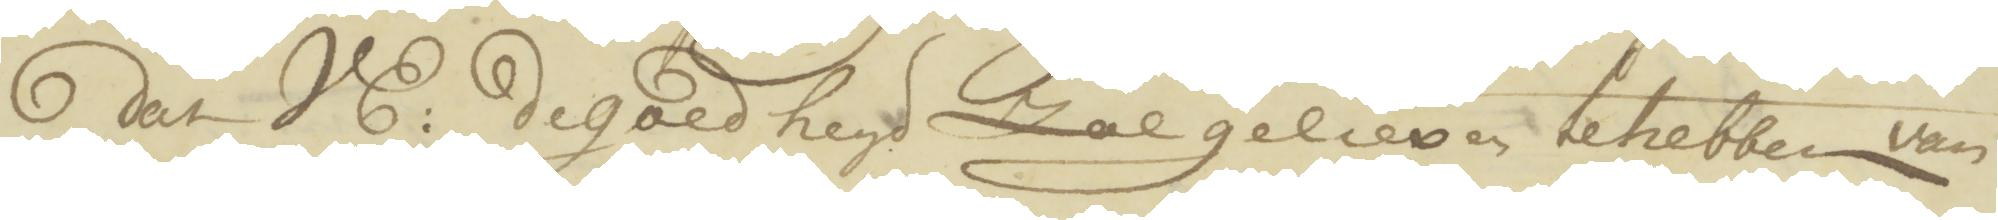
dat VE: de goedheyd zal gelieven te hebben van
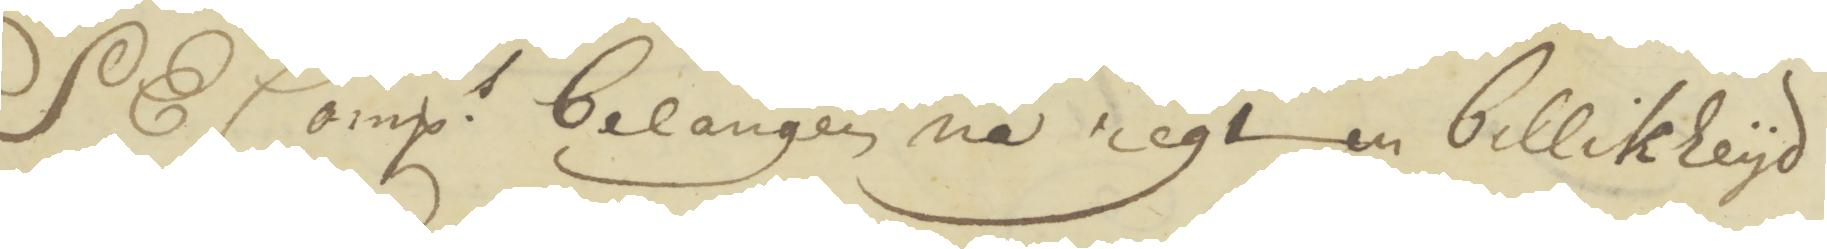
S E Comp.s belangen na regt en billikheijd
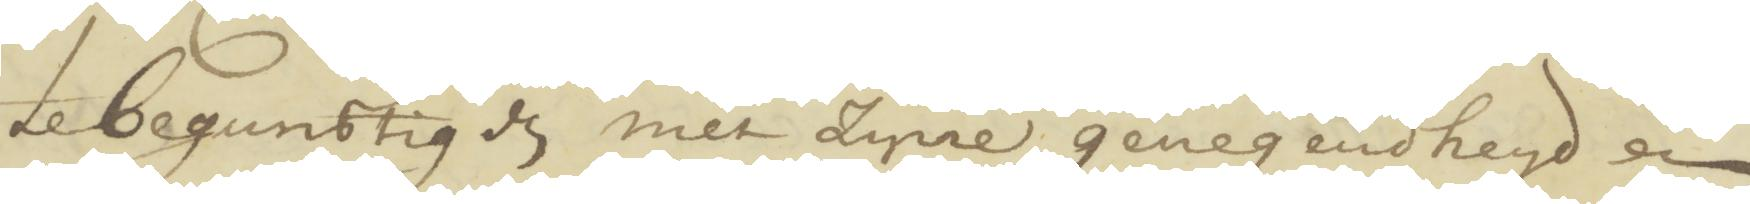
te begunstigen met zyne genegendheyd en
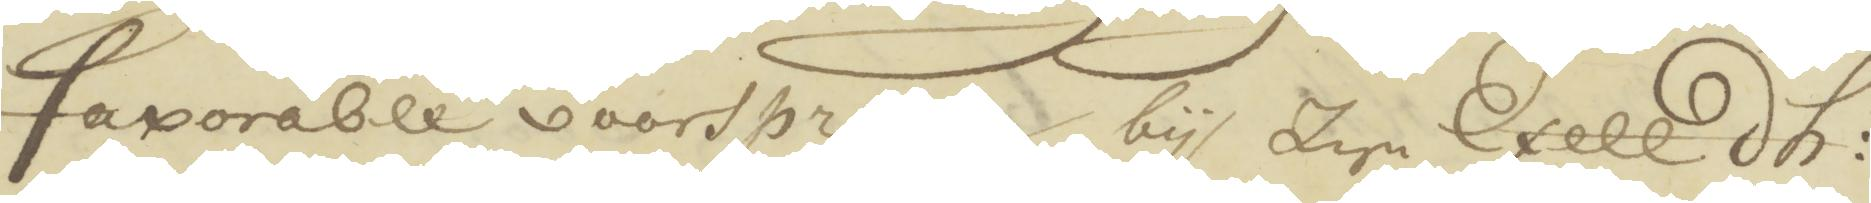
favorable voorspraake bij zyn Exell d h:r
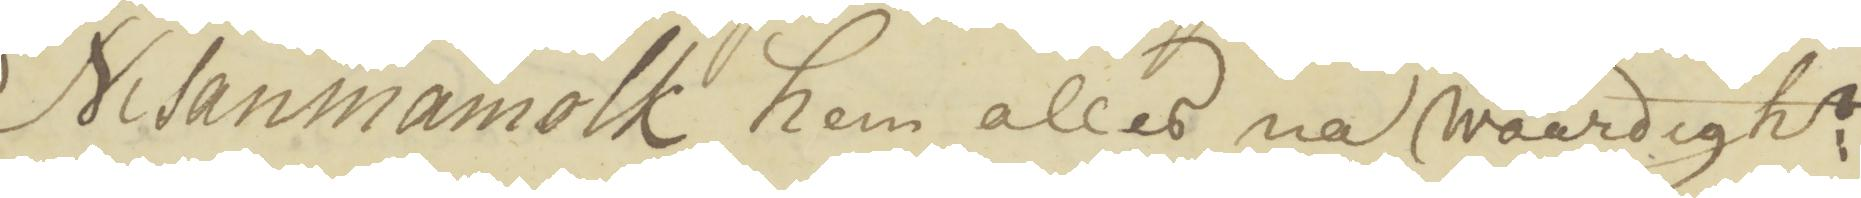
Nisanmamolk hem alles na waardight:t
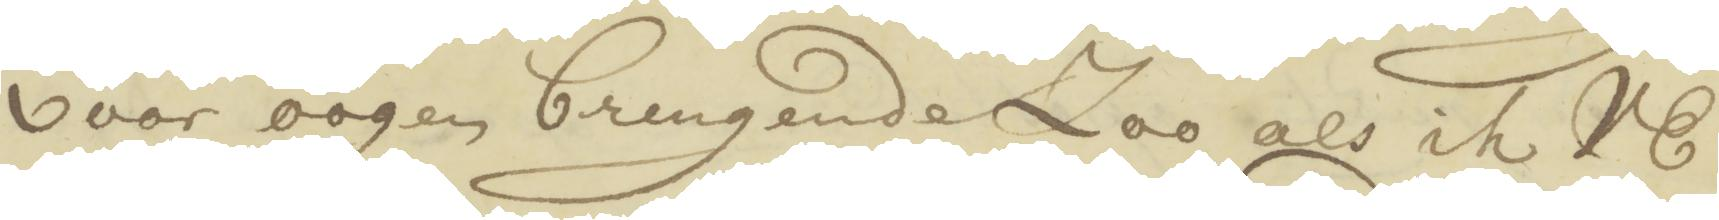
voor oogen brengende zoo als ik VE
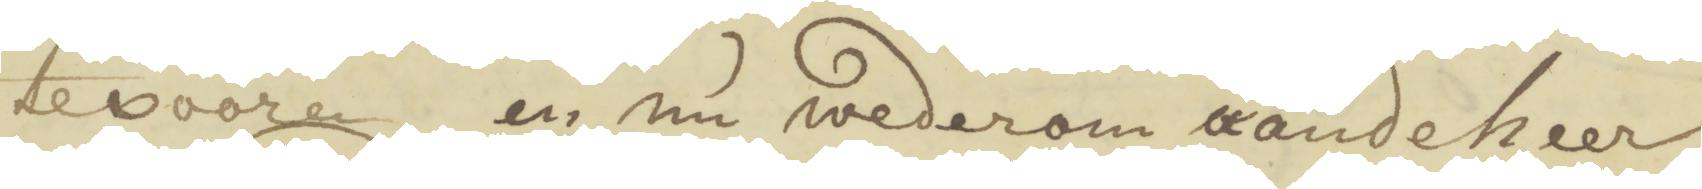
te vooren, en nu wederom aande heer
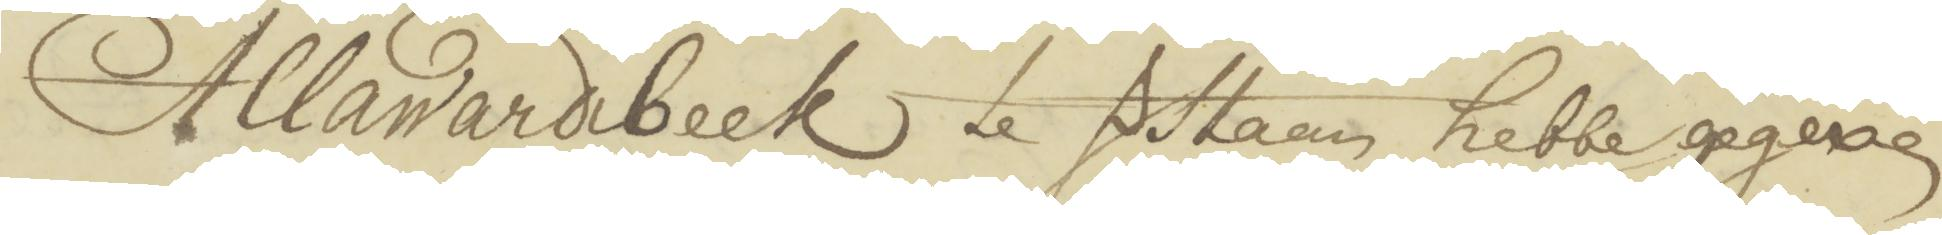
Allawardbeek te verstaan hebbe gegeven
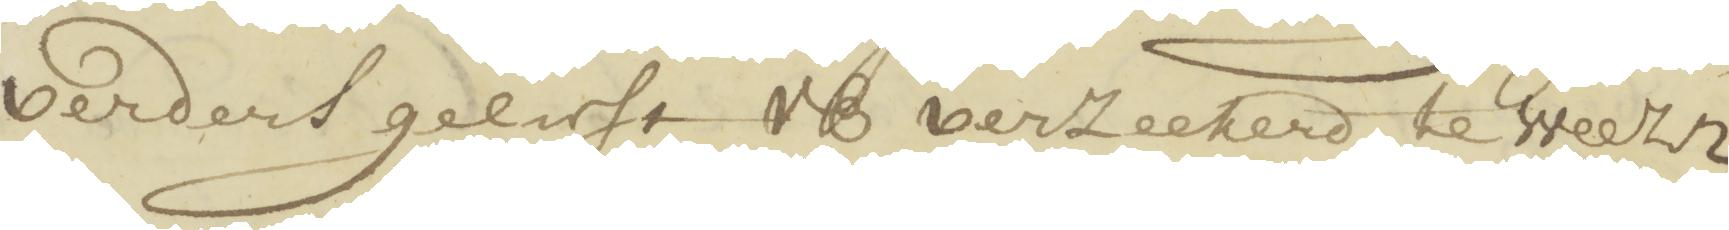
verders gelieft VE verzeekerd te weezen
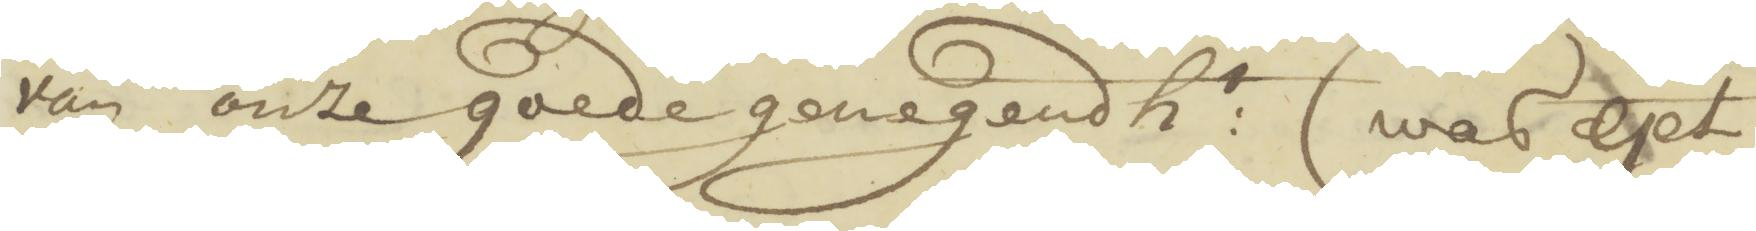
van onze goede genegendh:t (was get)
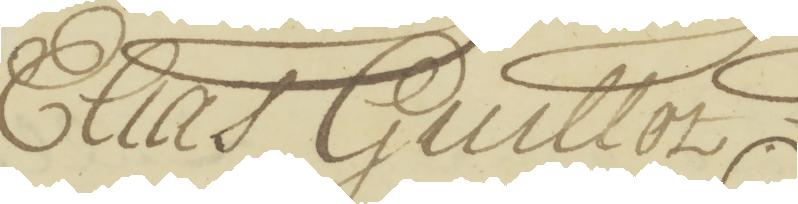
Elias Guillot:
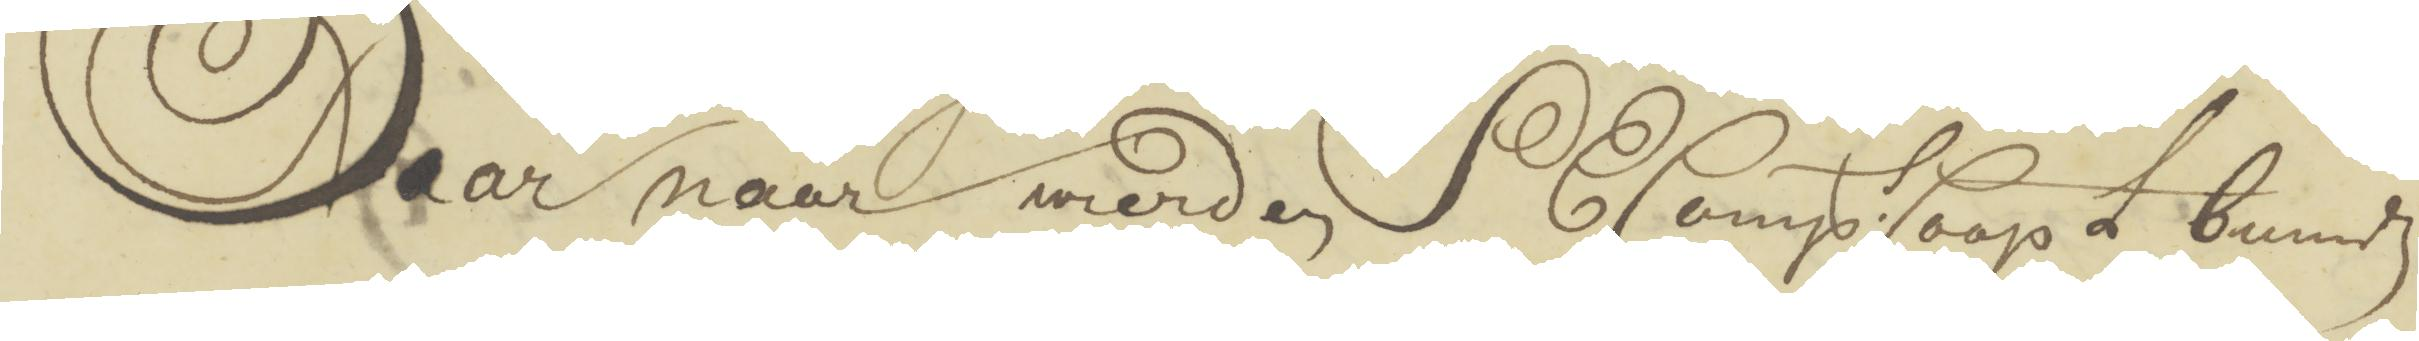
Daar naar werden S E Comp:s Coopl binnen
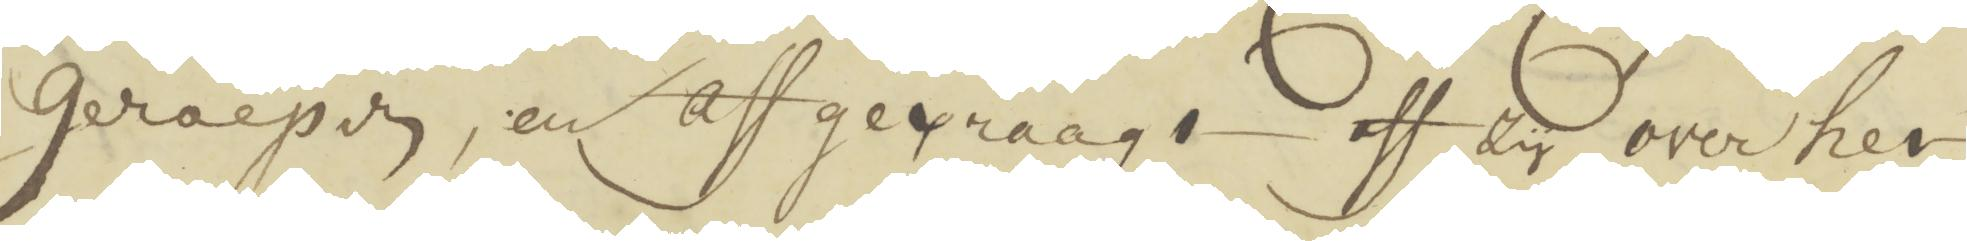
geroepen, en affgevraagt off en over het
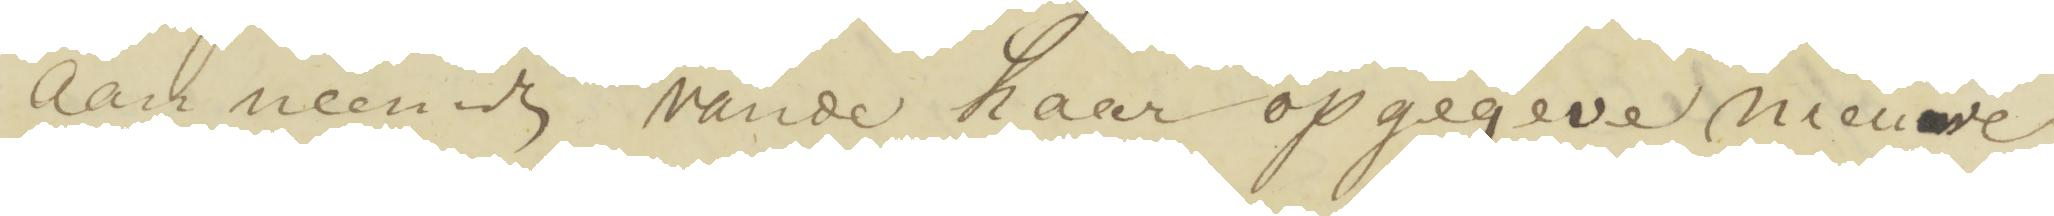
aan neemen vande haar op gegeve nieuwe
